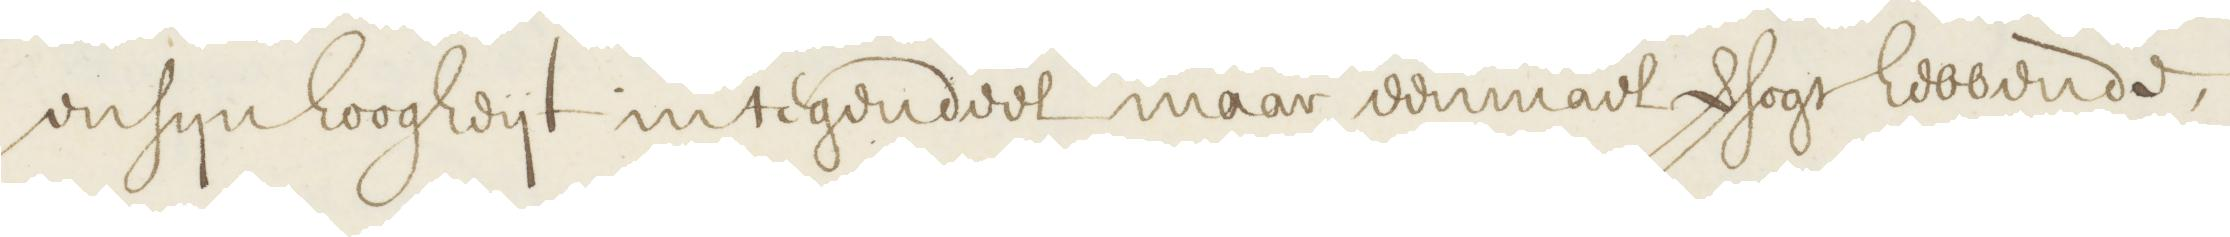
en syn hoogheijt in tegendeel maar eenmael versogt hebbende,
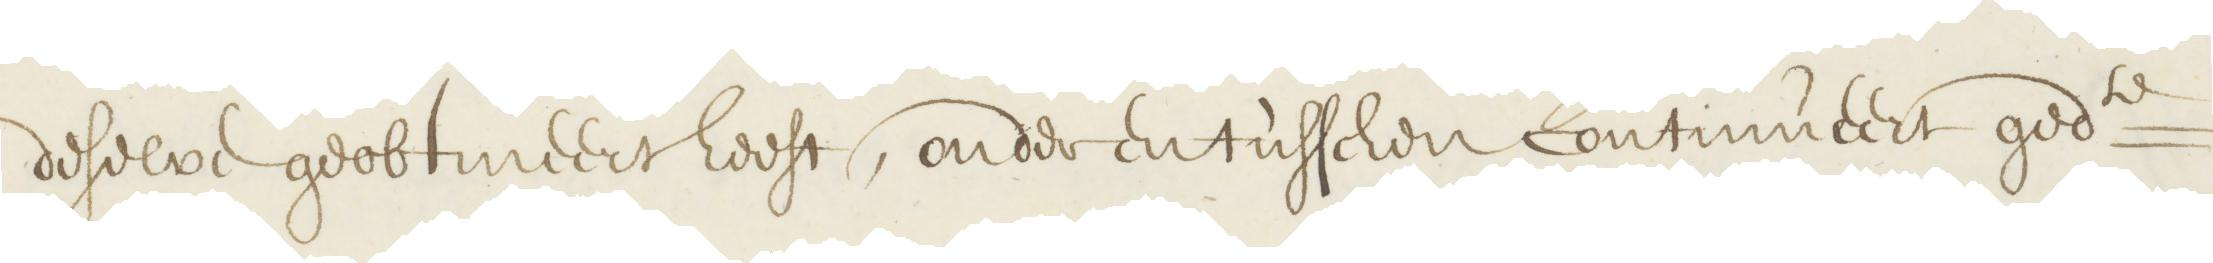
deselve geobtineert heeft, onder en tusschen continueert ged=se
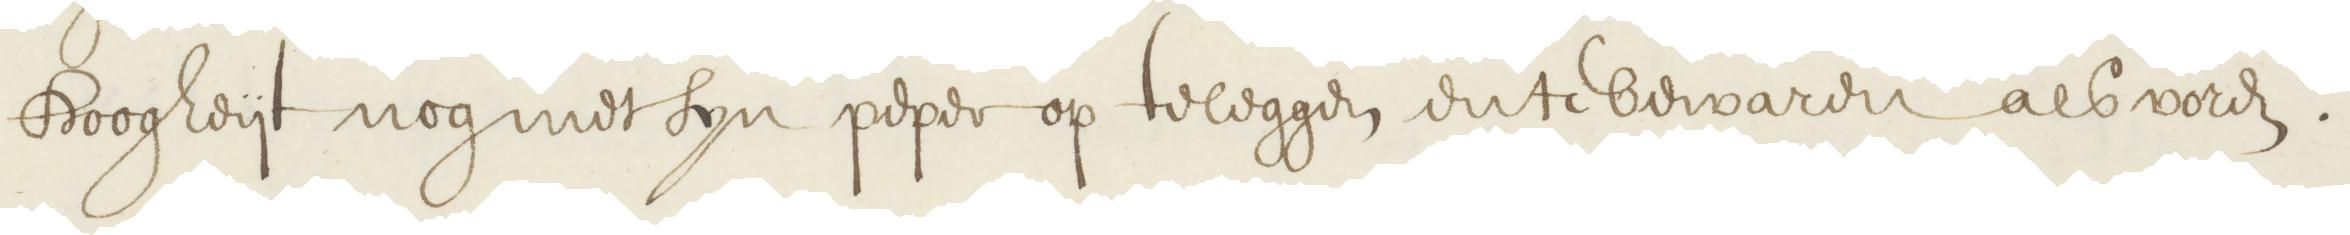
Hoogheijt nog met syn peper op te leggen en te bewaren als voren.
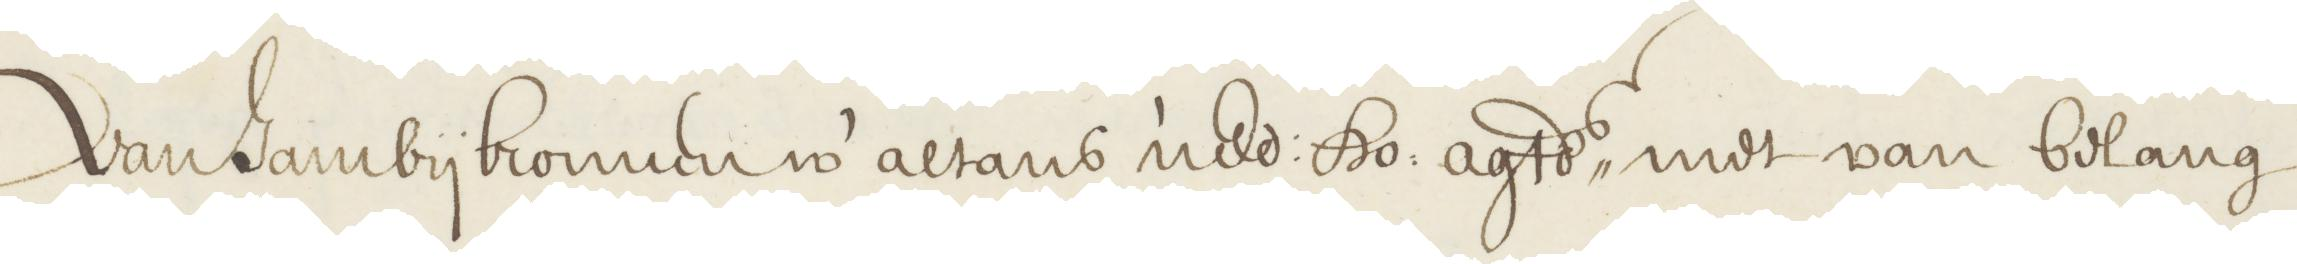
Van Iambij konnen w' altans uEd: Ho: agtb„s met van belang
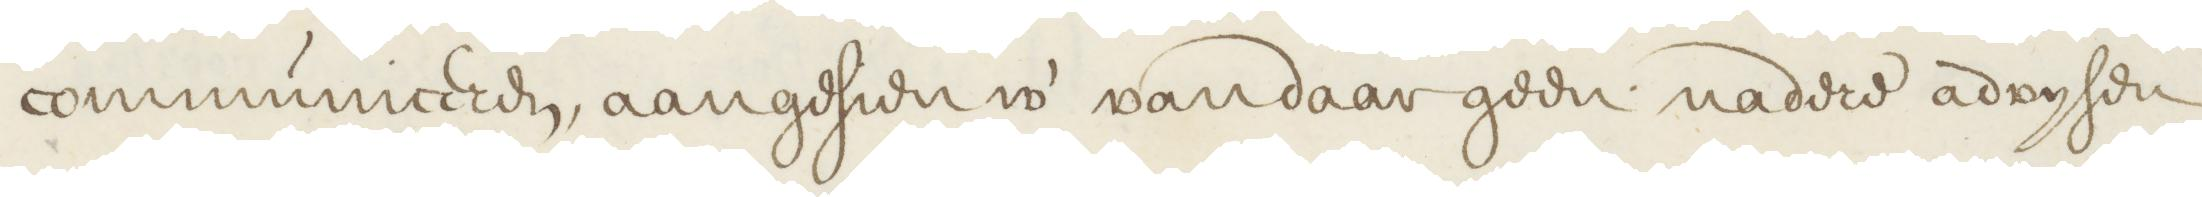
communiceren, aangesien w' van daar geen nadere advysen
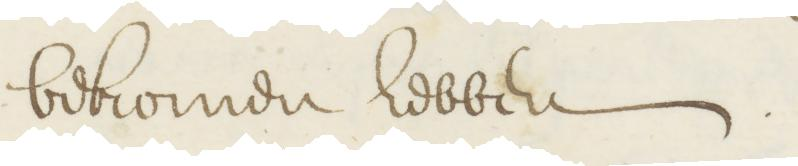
bekomen hebben.
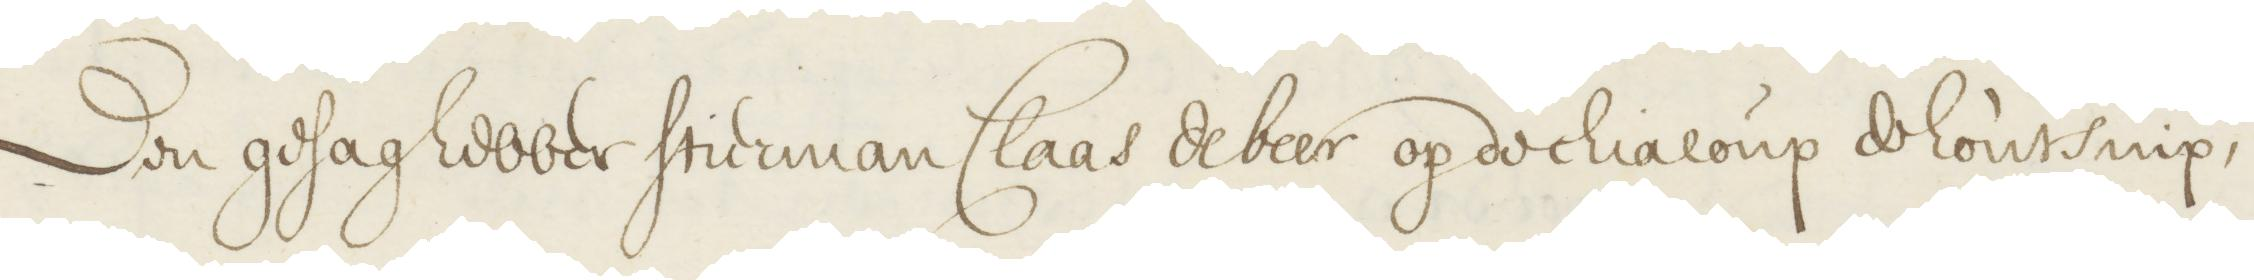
Een gesaghebber stierman Claas de beer op de chialoup de houtsnip,
